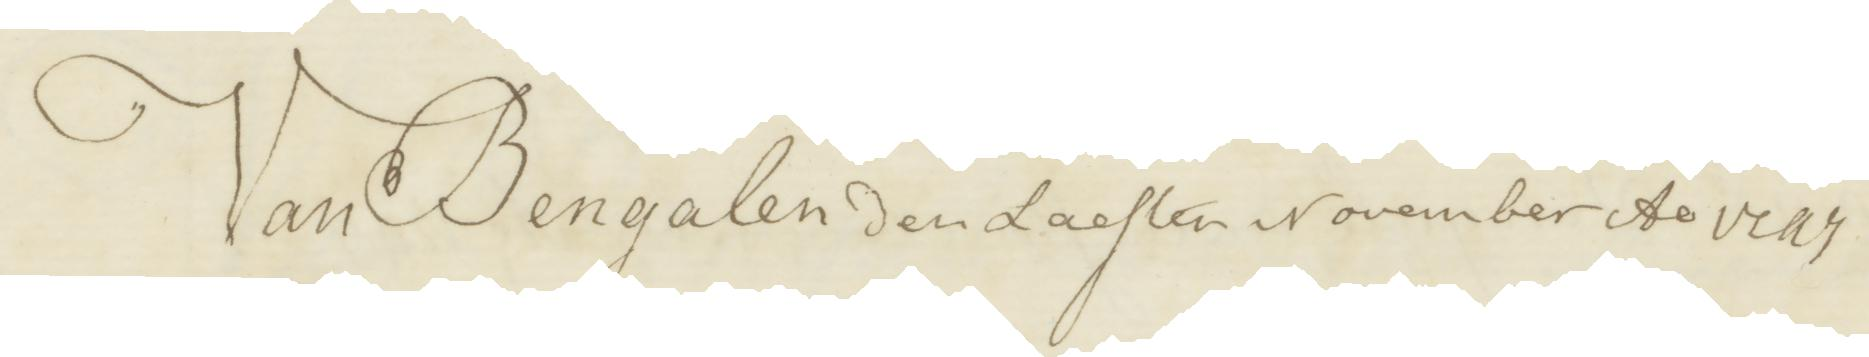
Van Bengalen den Laesten November Ao 1747
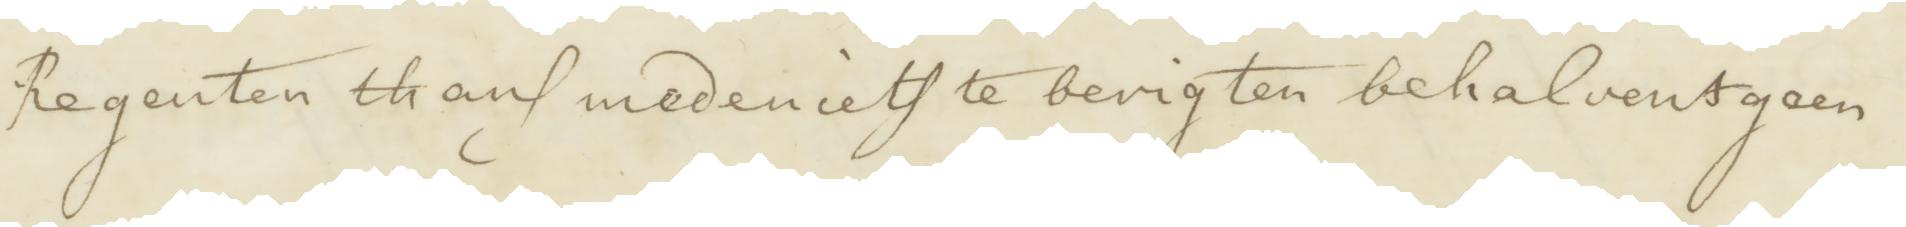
Regenten thans mede niets te berigten behalven tgeen
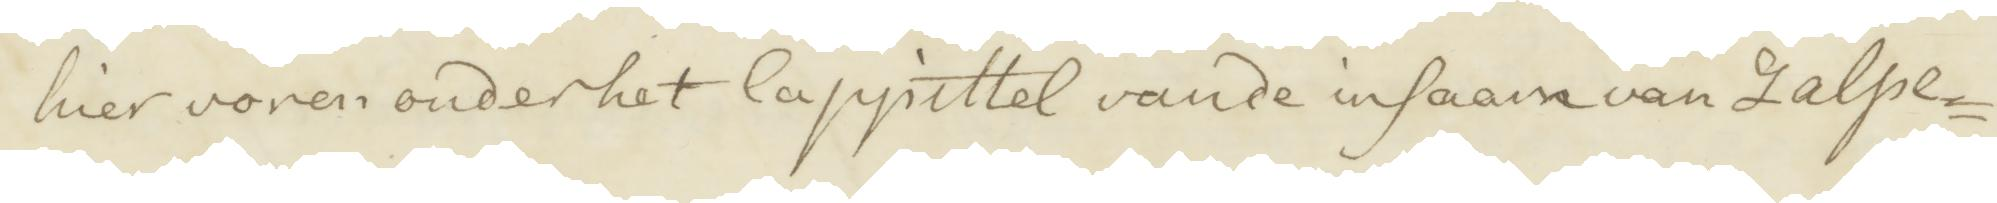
hier voren onder het kappittel vande insaam van zalpe„
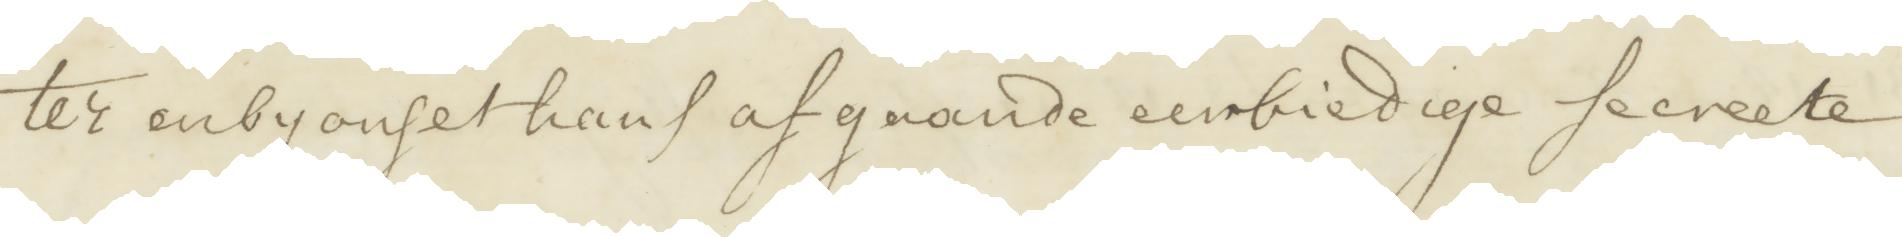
ter en by onse thans afgaande eerbiedige secreete
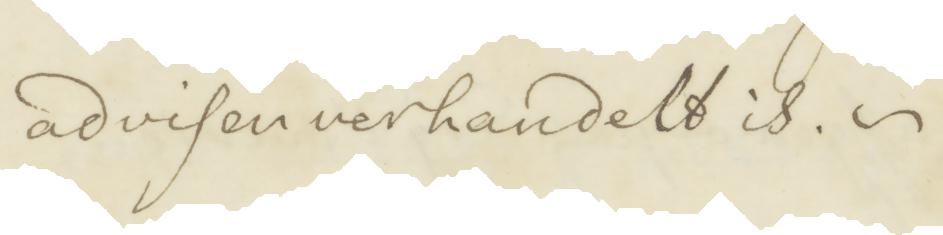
advisen verhandelt is. —
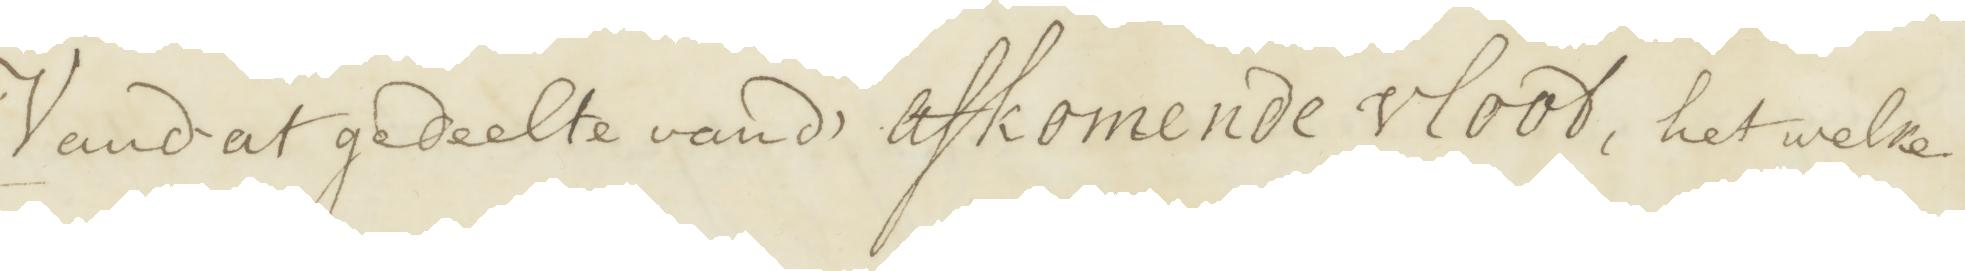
Van dat gedeelte van d’afkomende vloot, het welke
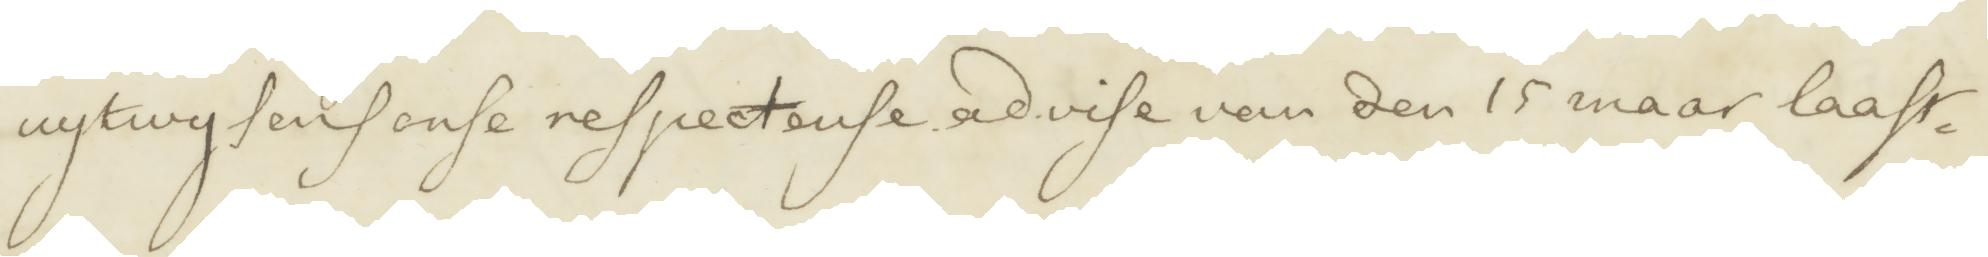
uytwysensense respecteuse advise van den 15 maar laast„
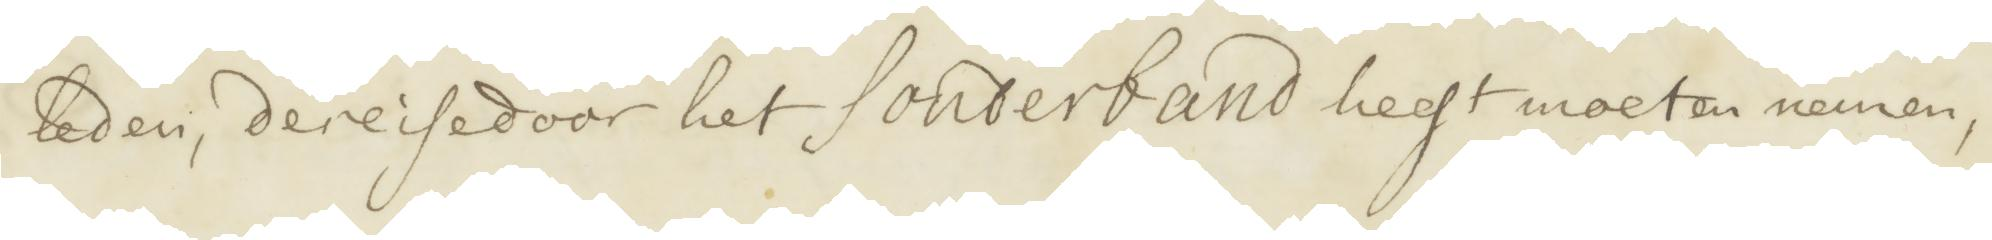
leden, de reise door het sonderband heeft moeten nemen,
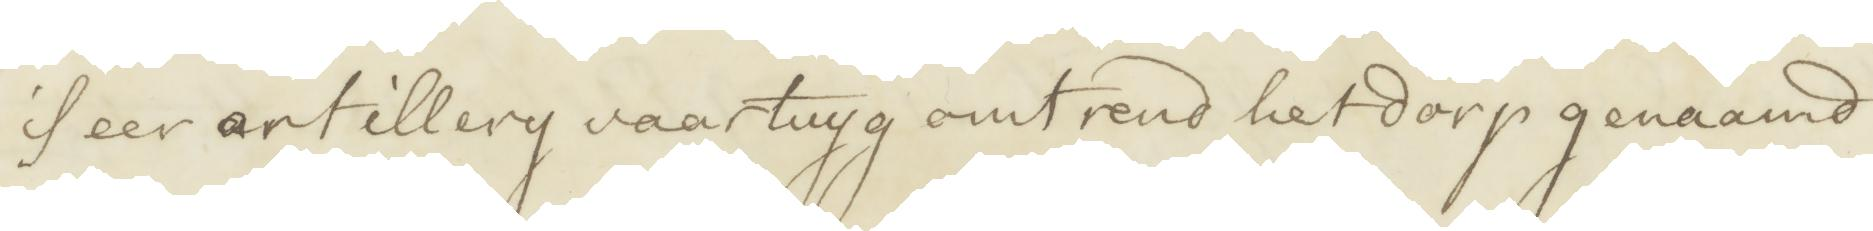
is eer artillery vaartuyg omtrend het dorp genaamd
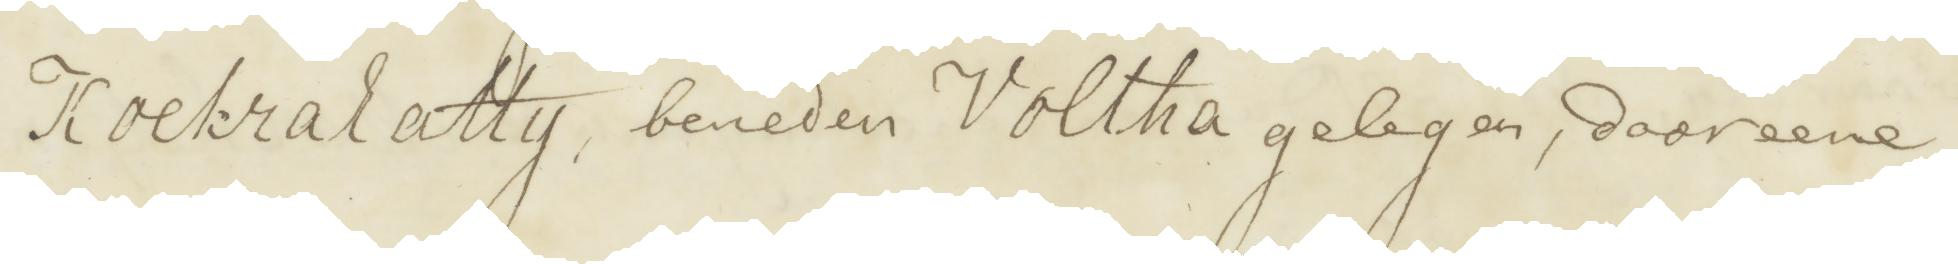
Koekrahatty, beneden Voltha gelegen, door eene
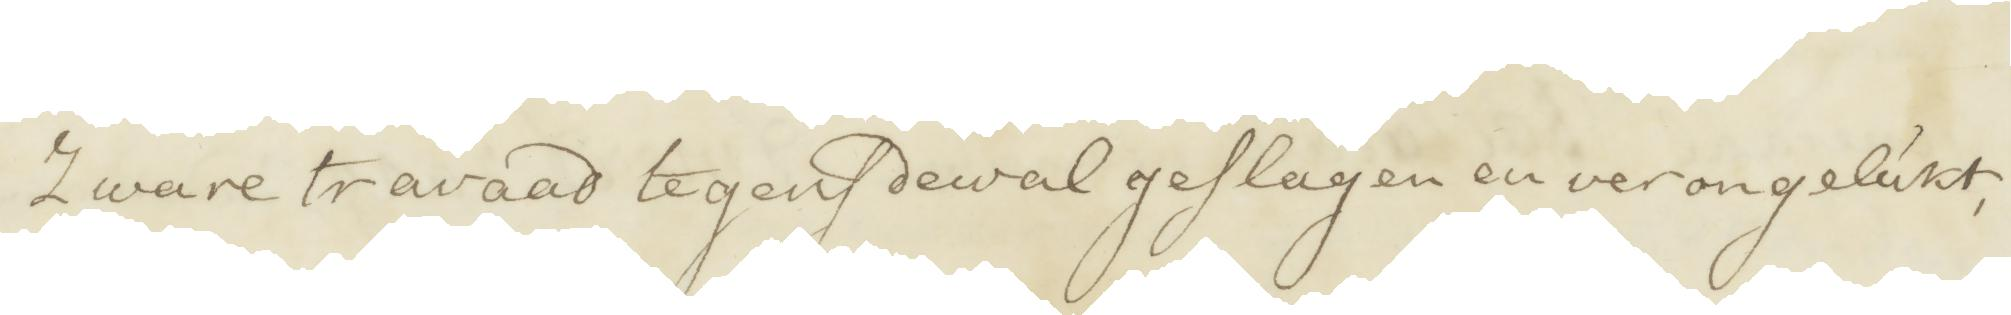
Zware travaad tegen de wal geslagen en verongelukt,
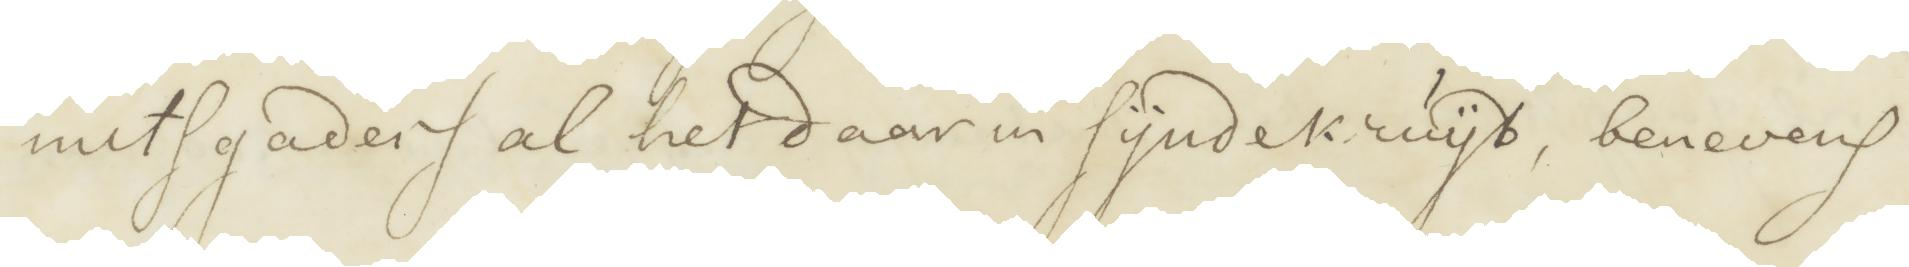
mitsgaders al het daar in sijnde kruijt, benevens
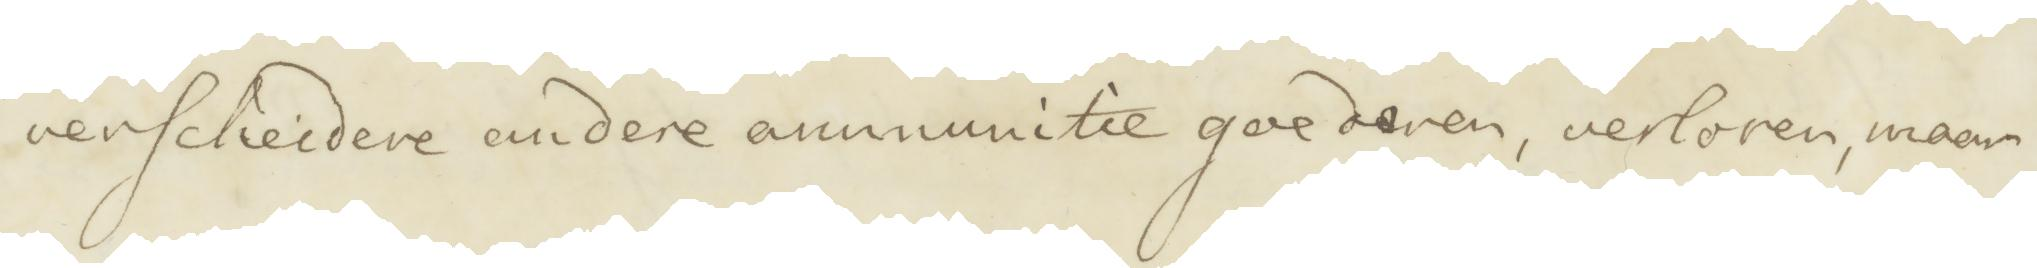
verscheidere andere ammunitie goederen, verloren, maar
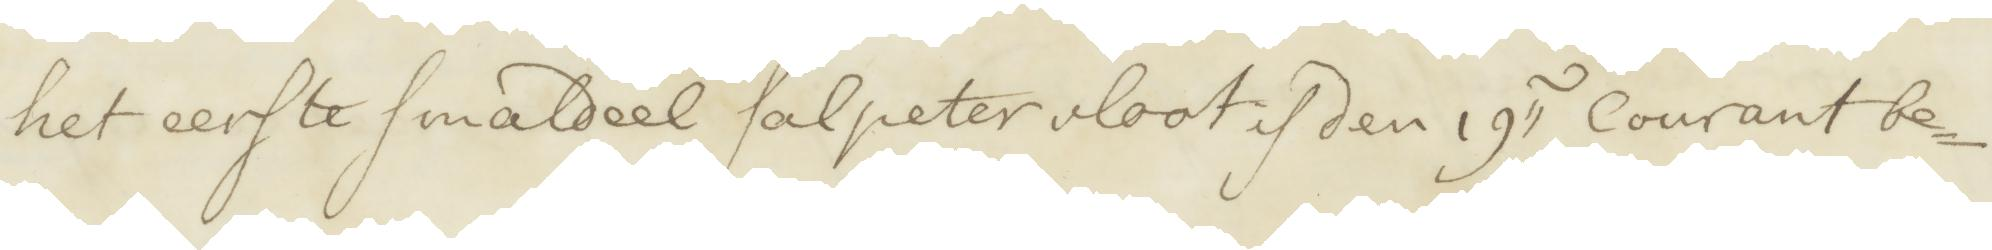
het eerste smaldeel salpetervloot is den 19„' Courant be„
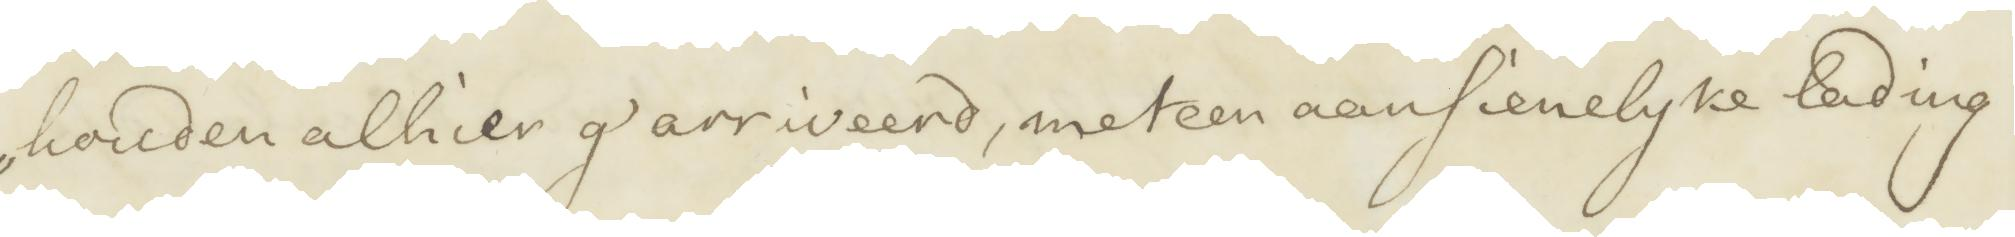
„houden alhier g’arriveerd, met een aansienelyke lading
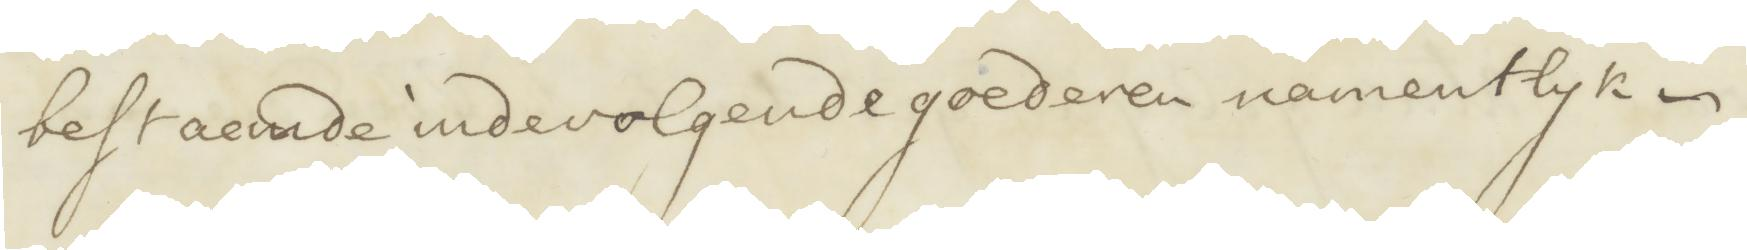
bestaande inde volgende goederen namentlyk —
